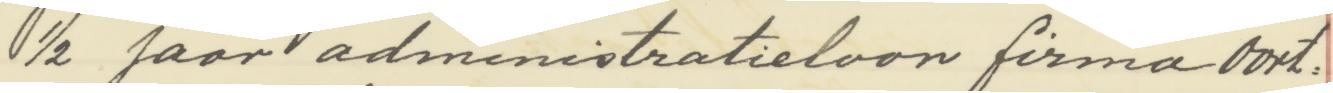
½ jaar administratieloon firma Oort=
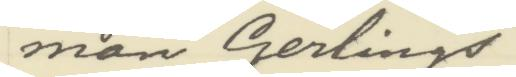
man Gerlings
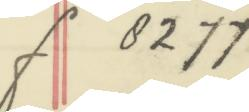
ƒ 8277
